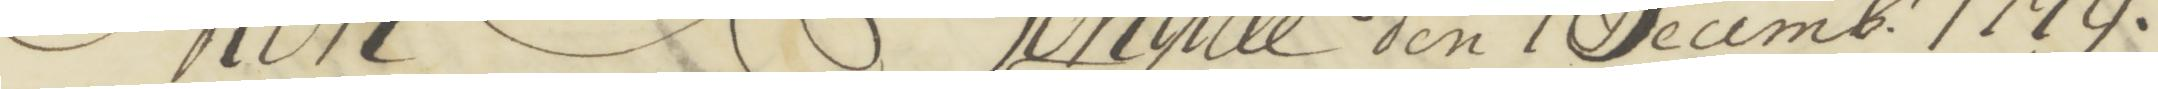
Van Bengale den 1 Decemb.' 1749.
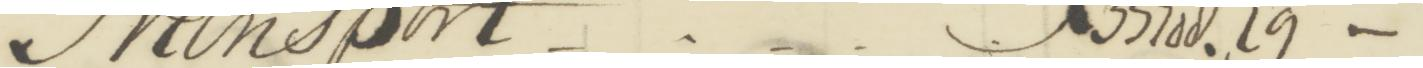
Transport ƒ 35708. 19 —
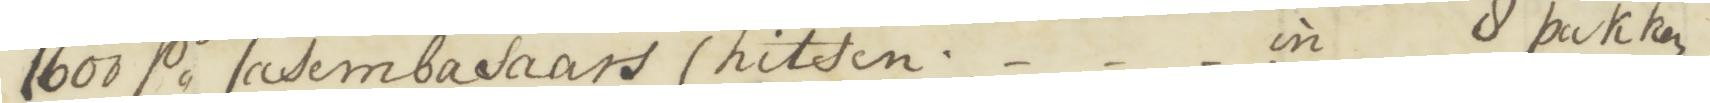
1600 P„s Casembasaars Chitsen - - - in 8 pakken
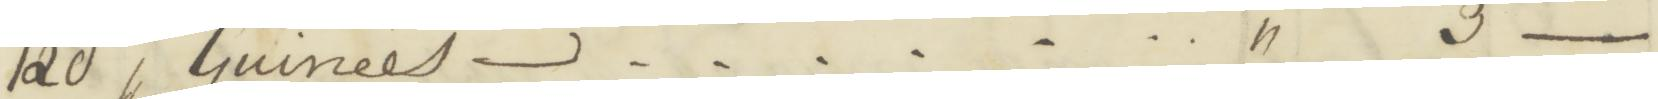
120 „ Guinees — - - - - - - - „ 3 —
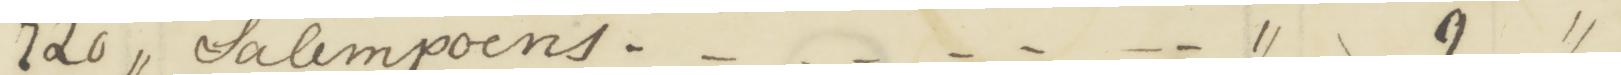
720 „ Salempoens - - - - - - - - „ 9 „
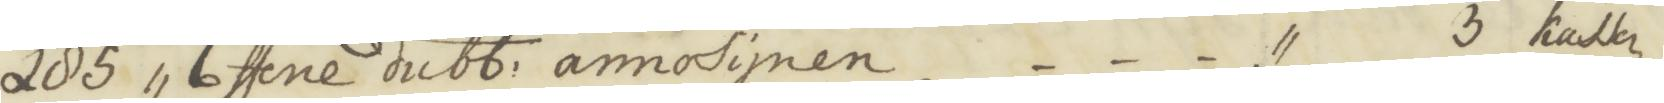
285 „ Effene dubb: annosijnen - - - - - „ 3 kassen
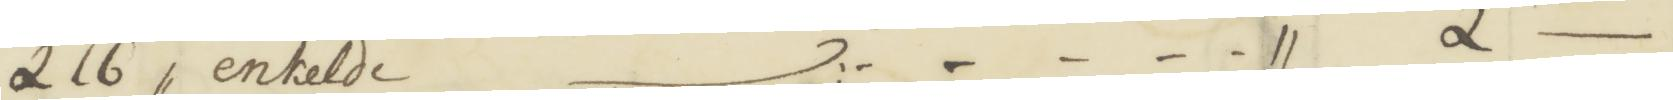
216 „ enkelde D: - - - - - „ 2 —
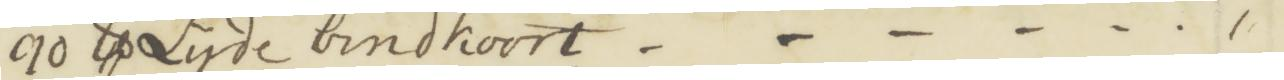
40 lb Zijde bindkoort - - - - - - „
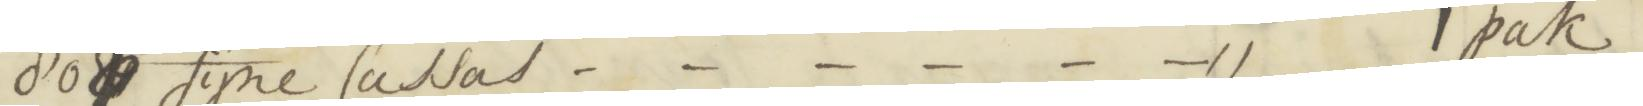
80 p' fijne Cassas - - - - - - „ 1 pak
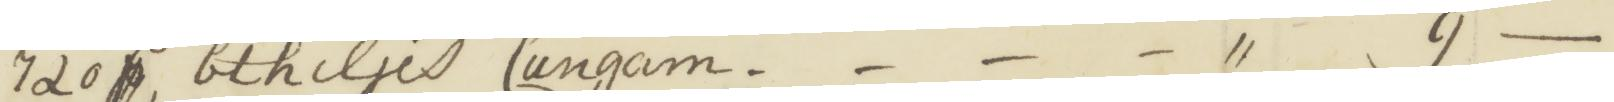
720 p„s bthiljis Cungam - - - - „ 9 —
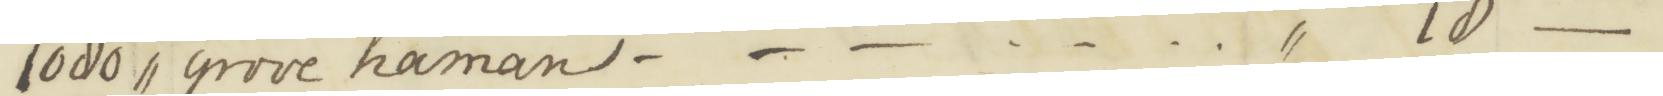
1080 „ grove haman „ - - - - - - - 18 —
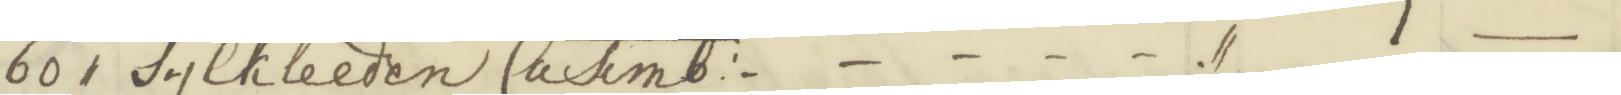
60 „ sylkleeden Casemb: - - - - - „ 1 —
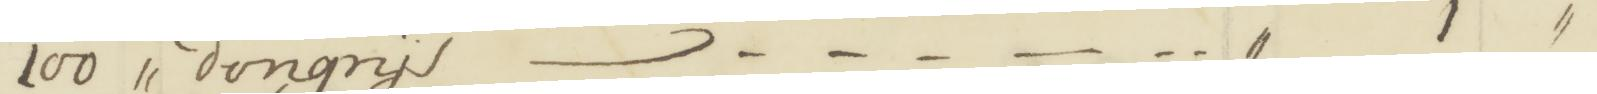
100 „ dongrijs — - - - - - - „ 1 „
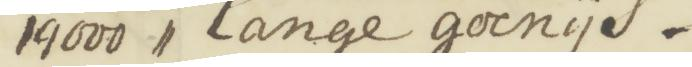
14000 „ lange goenijs -
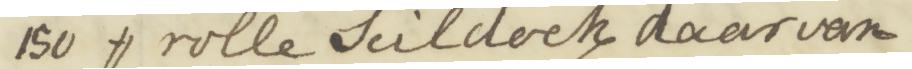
150 „ rolle seildoek daar van
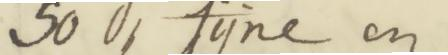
50 d„o fijne en
